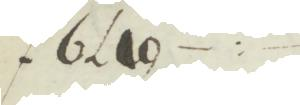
ƒ 6249 — : —
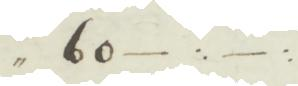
„ 60 — : —:
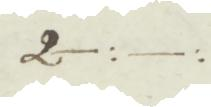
2 —: —:
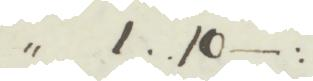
„ 1.. 10 —:
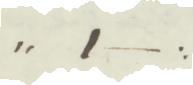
„ 1 —.
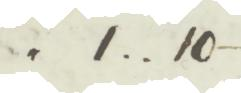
„ 1..10 —
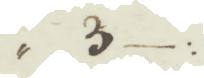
„ 3 —:
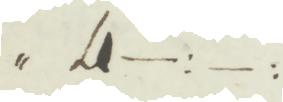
„ 4 —: —
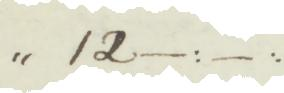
„ 12 —: —.
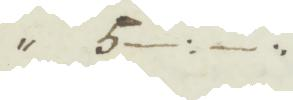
„ 5 —: —:
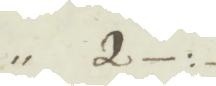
„ 2 —: —
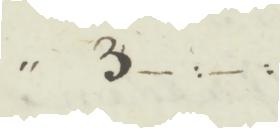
„ 3 —: —.
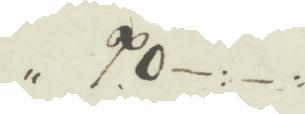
„ 70 —: —
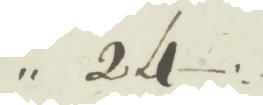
„ 24 —:
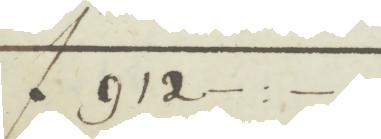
ƒ 912 —: —.
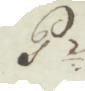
P=r
